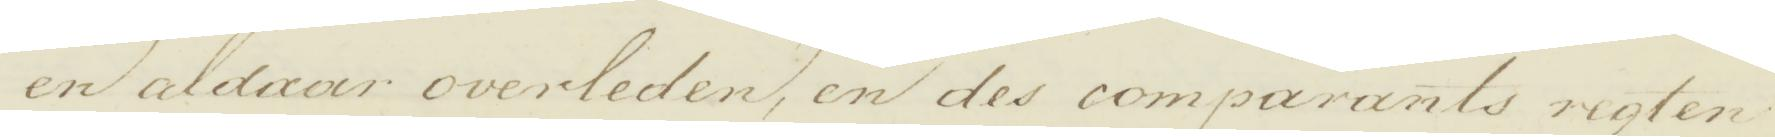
en aldaar overleden, en des comparants regten
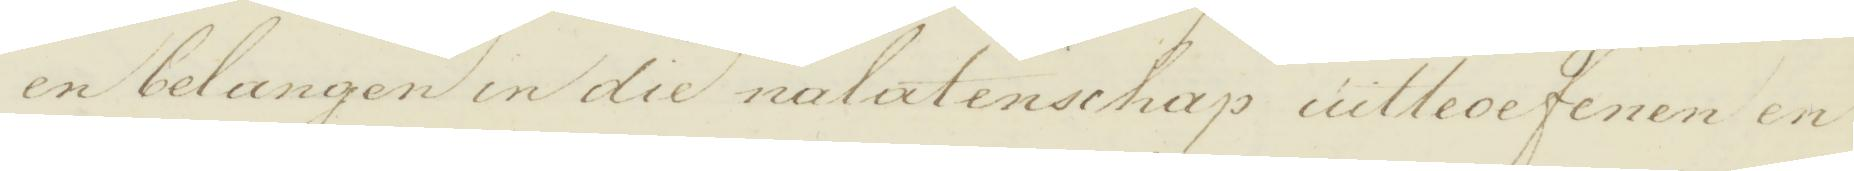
en belangen in die nalatenschap uitteoefenen en
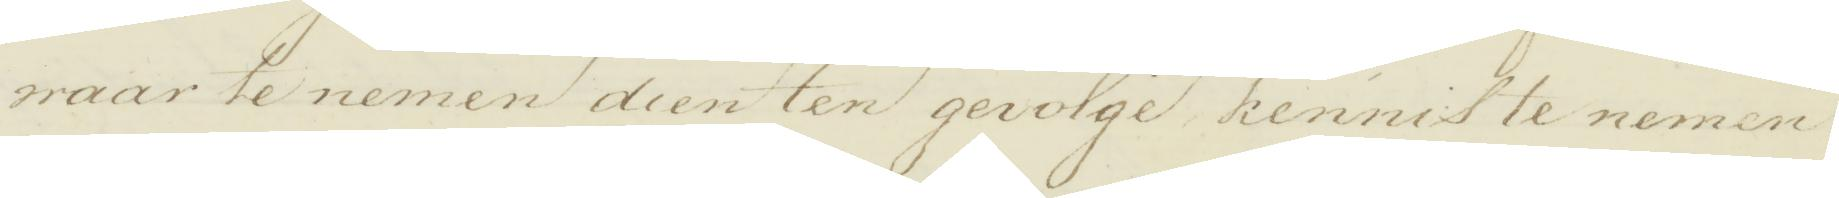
waar te nemen dien ten gevolge kennis te nemen
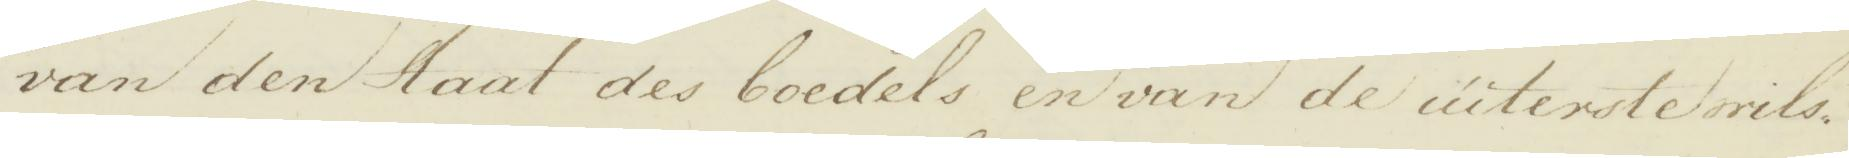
van den staat des boedels en van de uiterste wils„
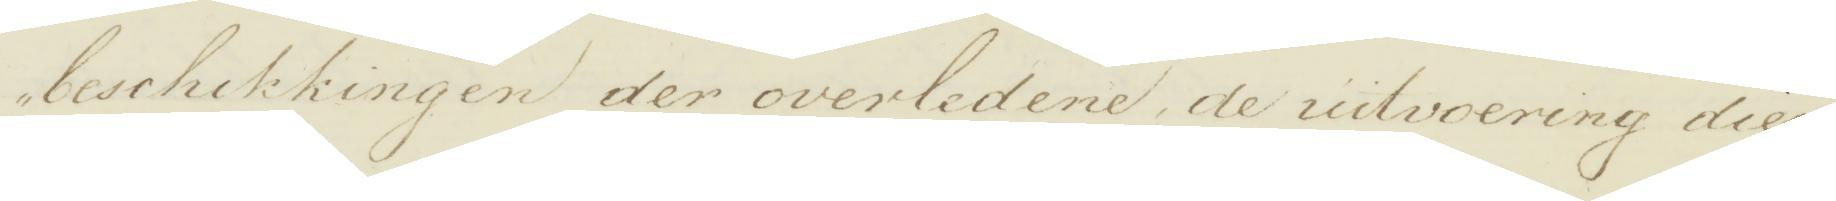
„beschikkingen der overledene, de uitvoering dier
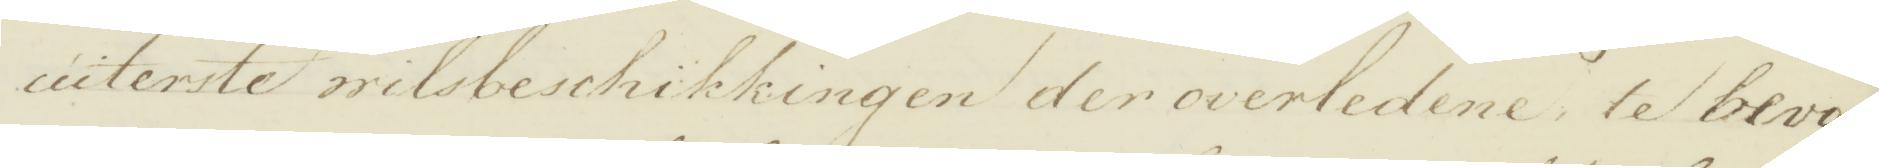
uiterste wilsbeschikkingen der overledene, te bevor
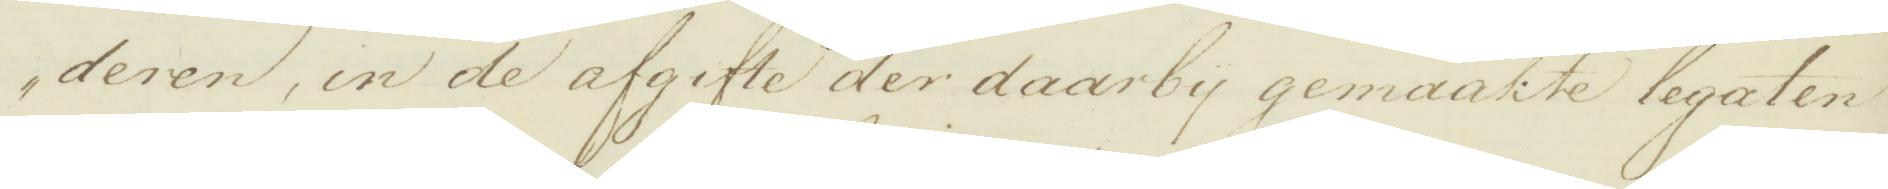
„deren, in de afgifte der daarbij gemaakte legaten
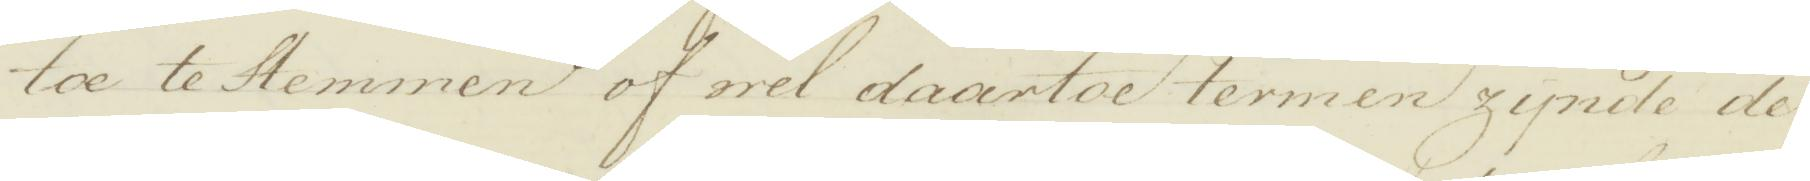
toe te stemmen of wel daartoe termen zijnde de
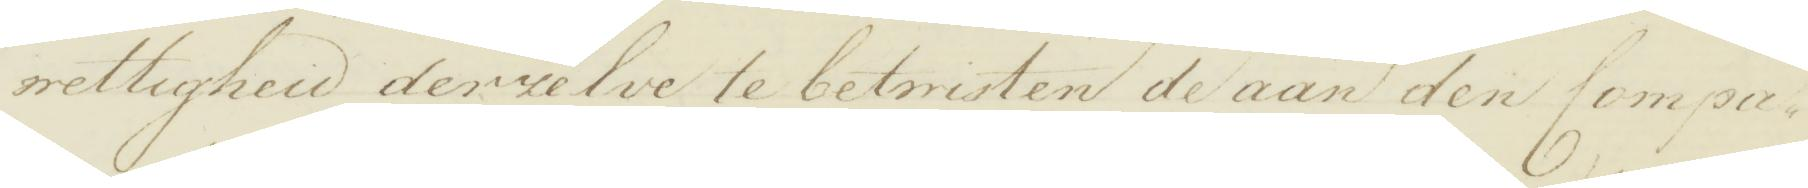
wettigheid derzelve te betwisten de aan den Compa„
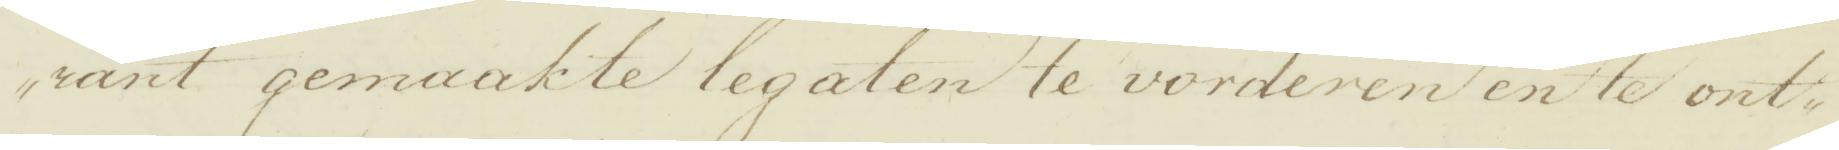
„rant gemaakte legaten te vorderen en te ont„
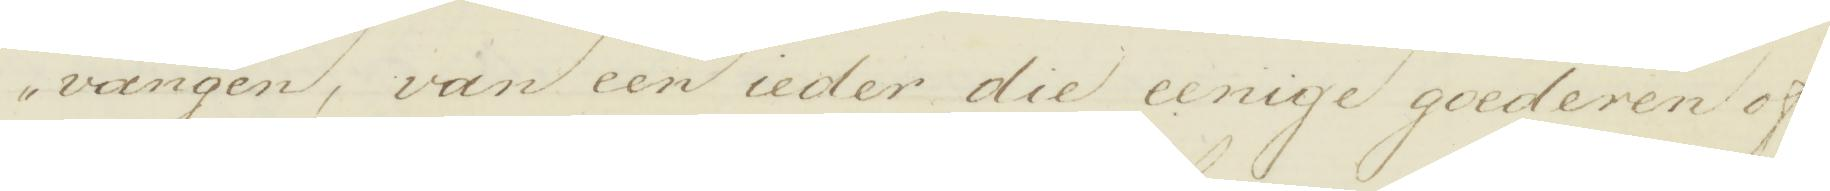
„vangen, van een ieder die eenige goederen of
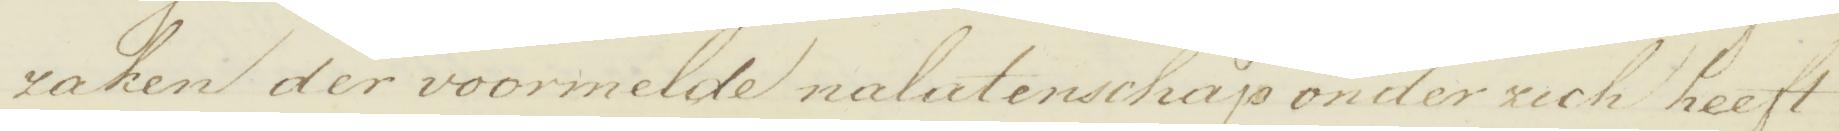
zaken der voormelde nalatenschap onder zich heeft
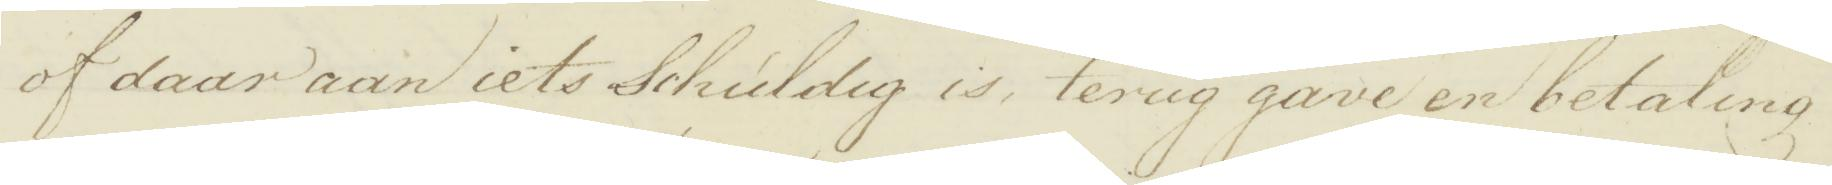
of daar aan iets schuldig is, terug gave en betaling
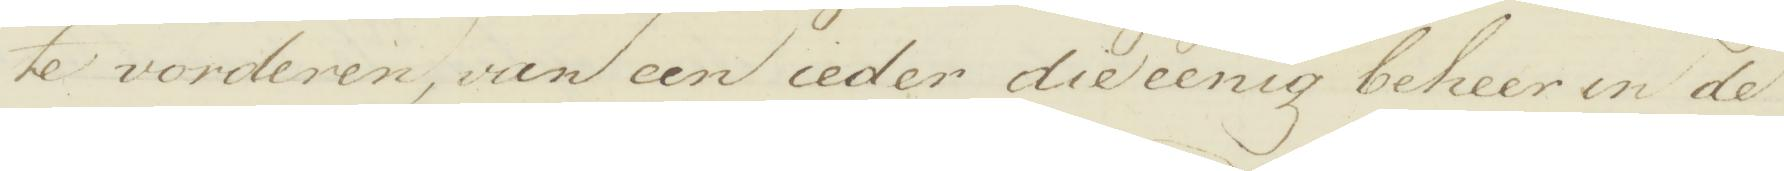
te vorderen, van een ieder die eenig beheer in de
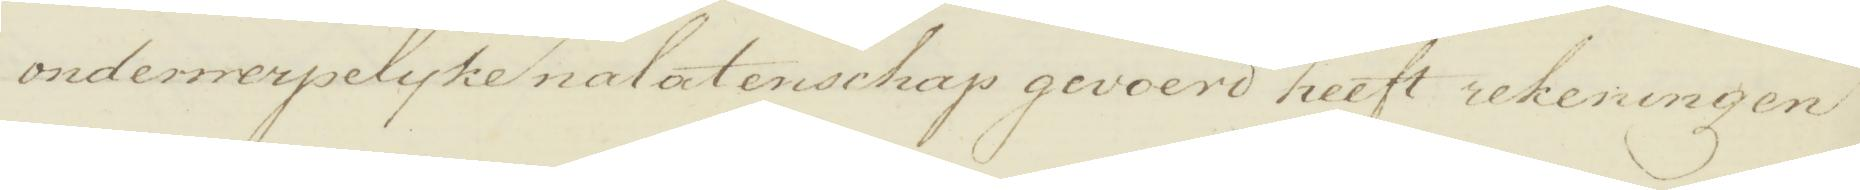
onderwerpelyke nalatenschap gevoerd heeft rekening en
